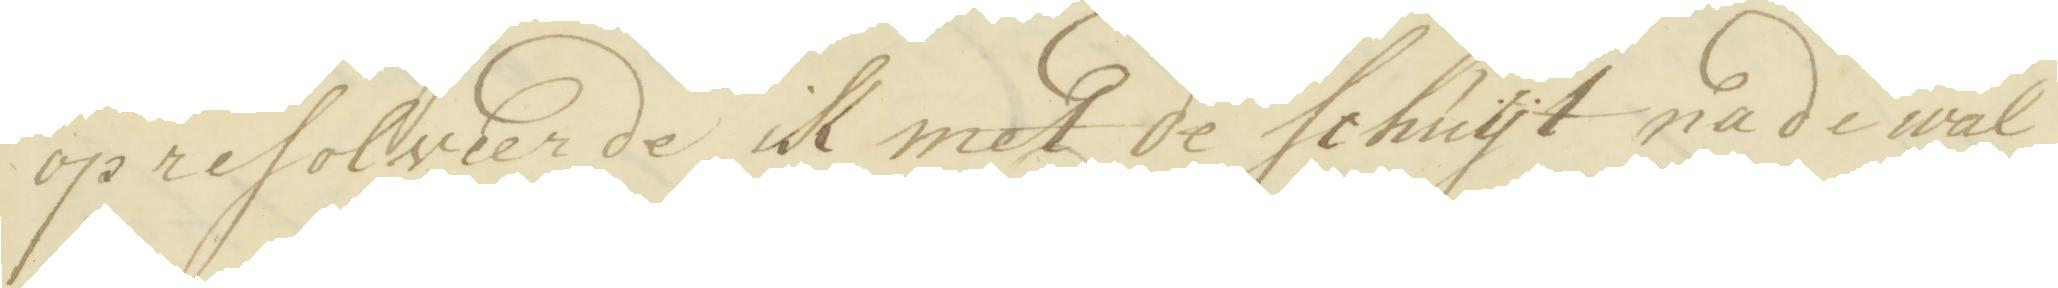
op resolveerde ik met de schuijt na de wal
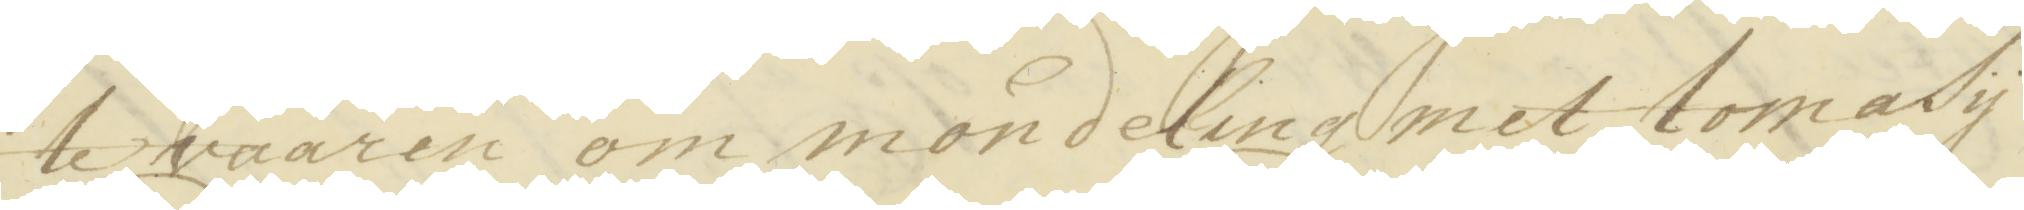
te vaaren om mondeling met tomasij
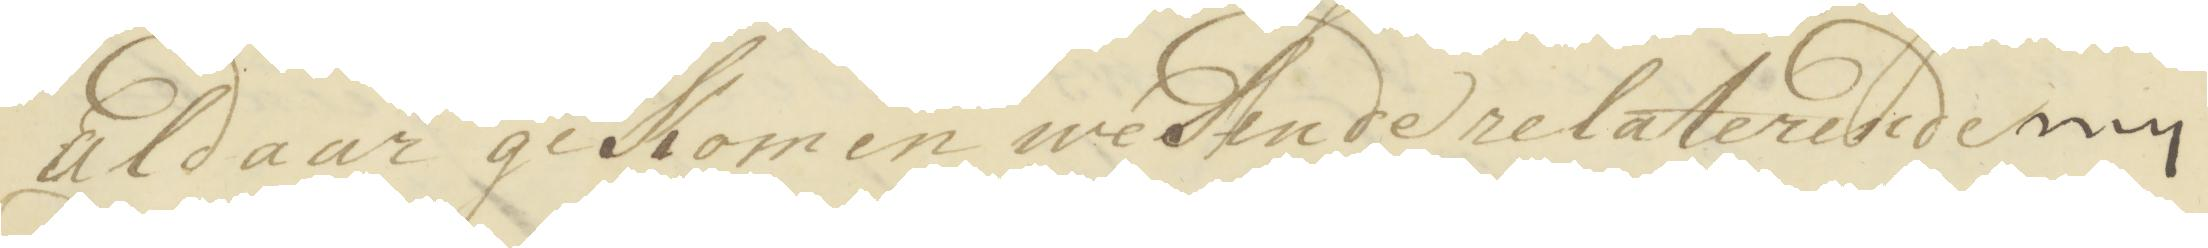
aldaar gekomen wesende relaterende my
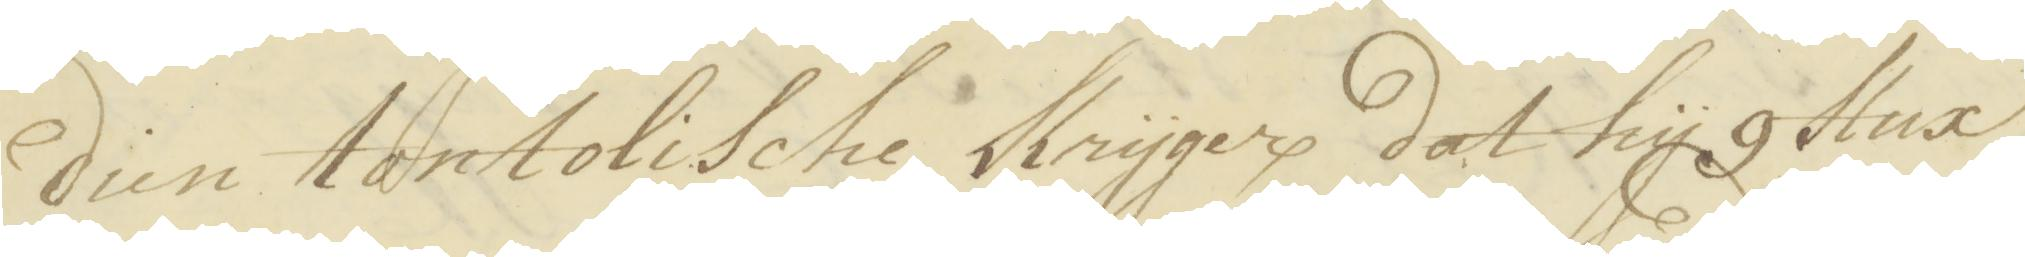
dien tontolische krijger dat hij 9 Stux
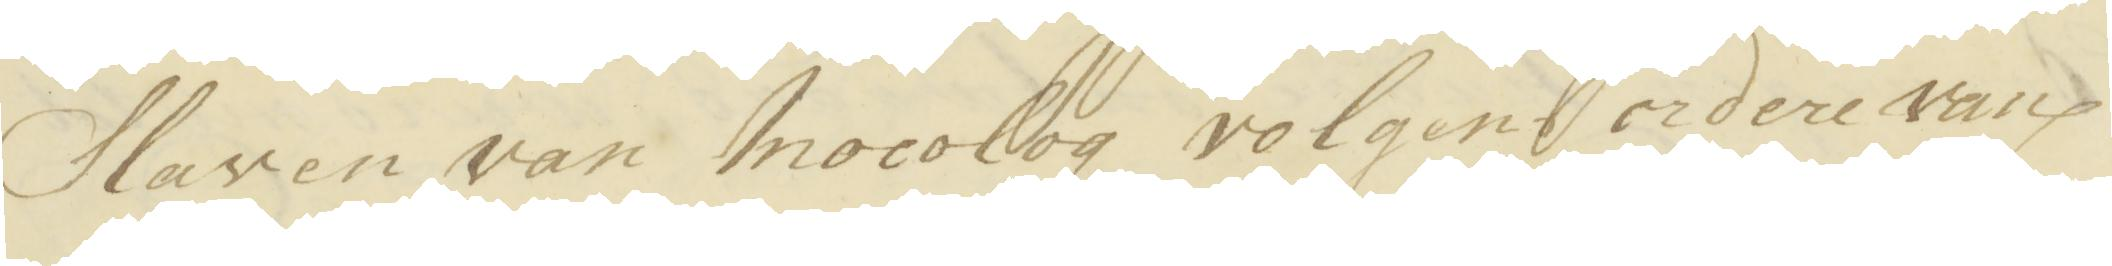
Slaven van Mocolog volgens ordere van
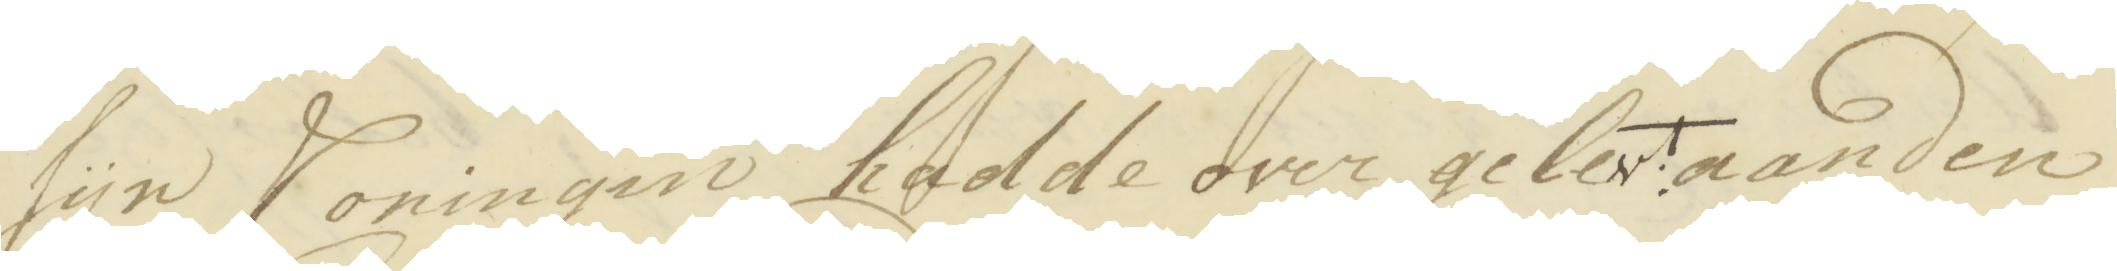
Sijn Coningin hadde over gelev:t aan den
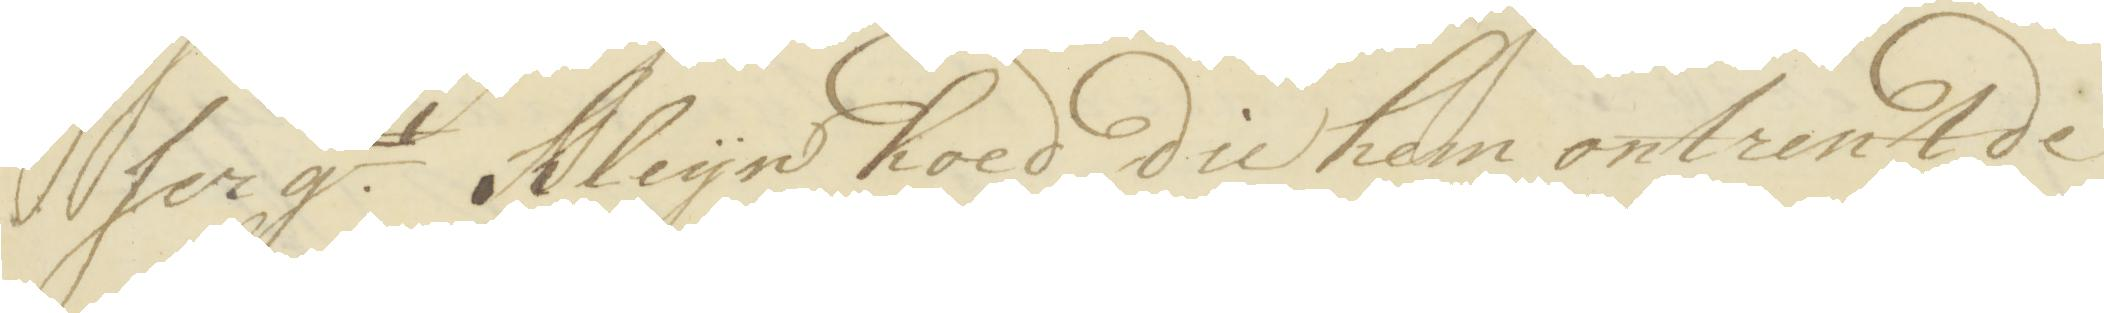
Serg=t Kleijnhoed die hem ontrent de
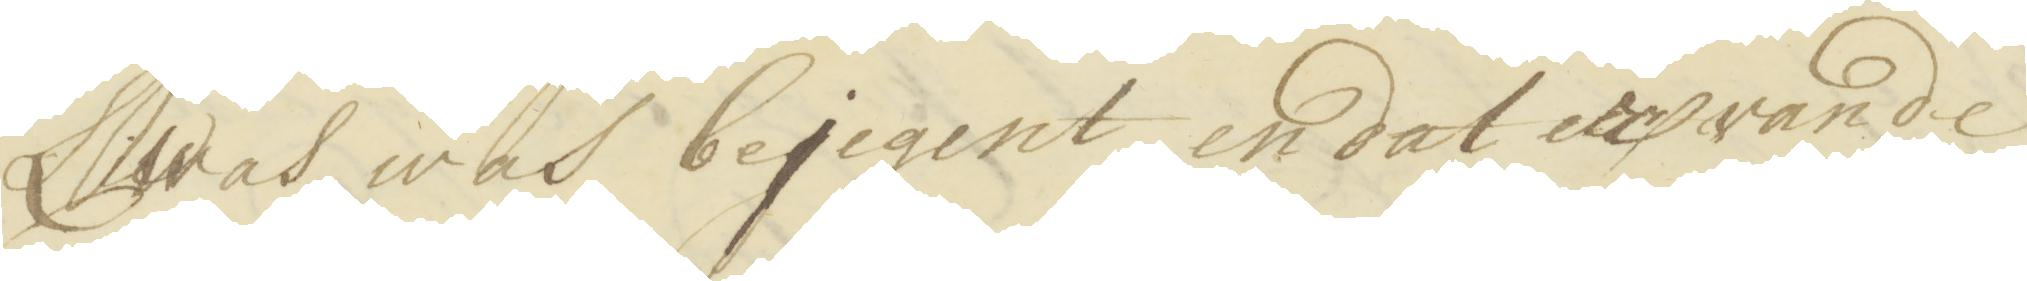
8 was was bejegent en dat er van de
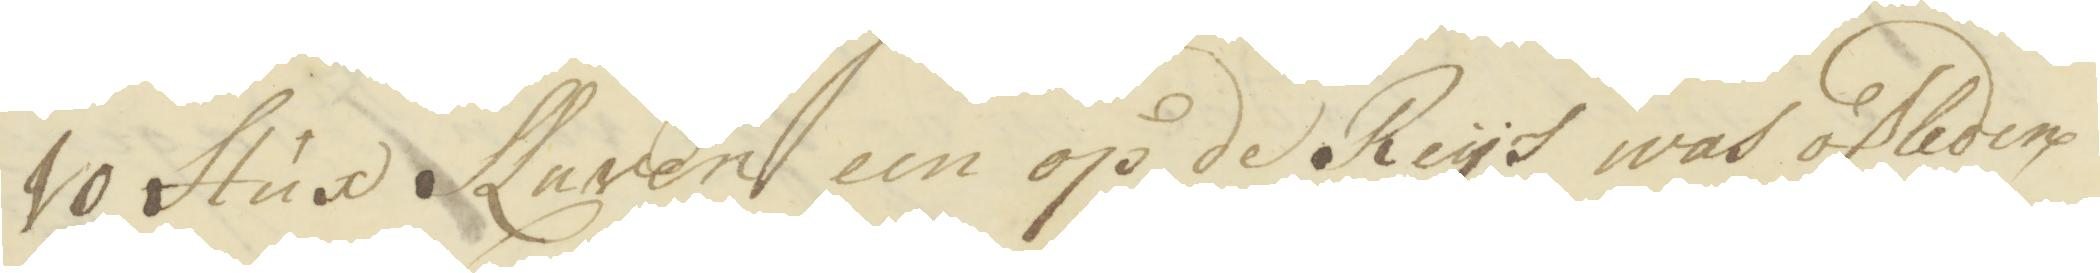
10 Stux Slaven een op de Reijs was overleden
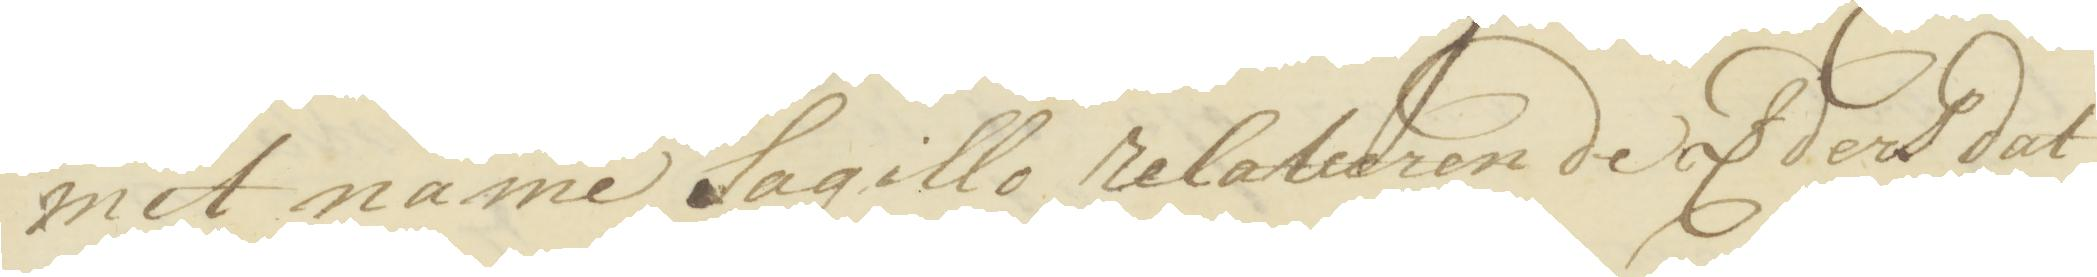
met name Sagillo relateeren de verders dat
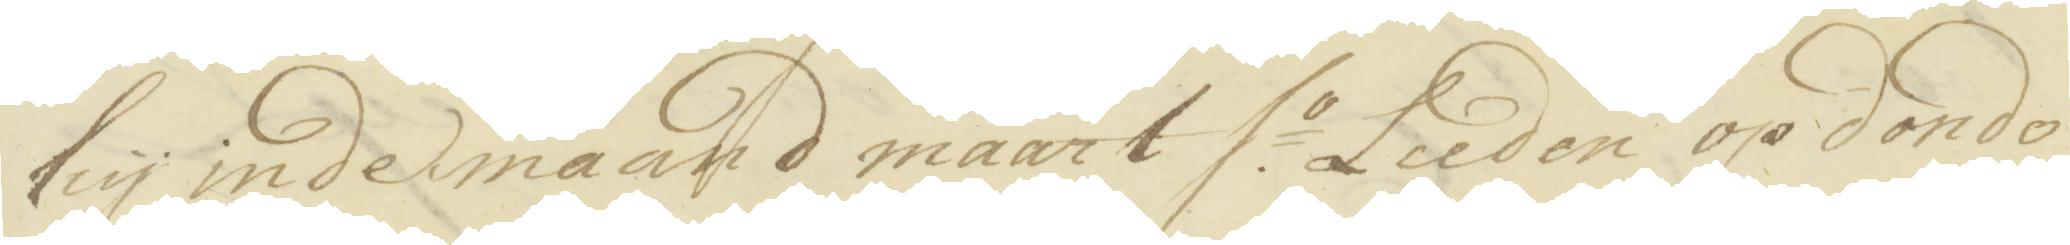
hij inde maand maart J:=o Leeden op dondo
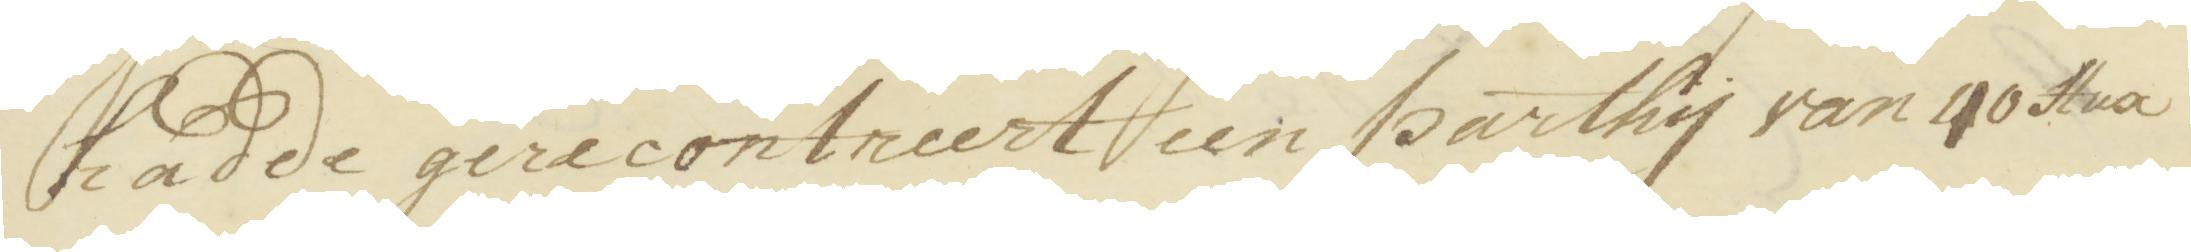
hadde gerecontreert een parthij van 40 Stux
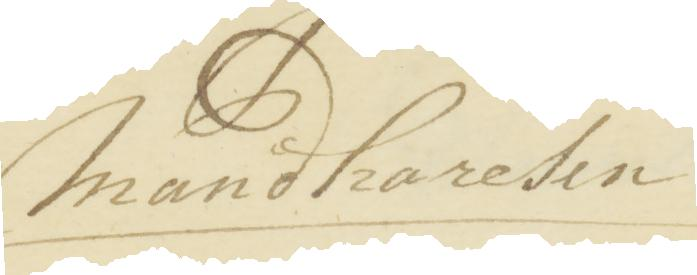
Mandharesen
